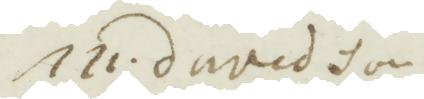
24. M. davidson
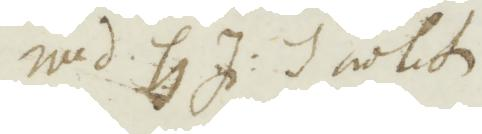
wed. G J:Sarlet
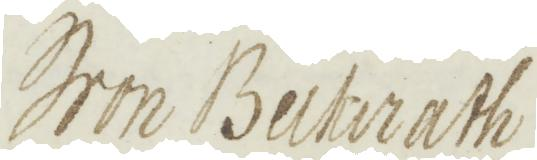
Von Berkerath
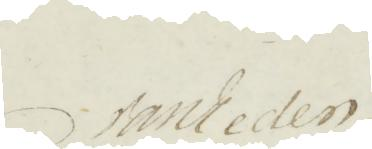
van Eeden
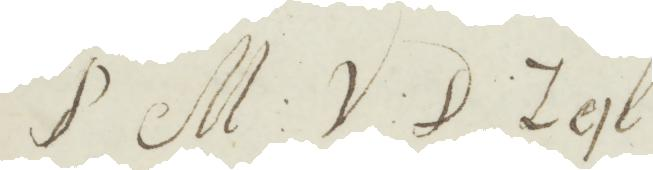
P M: V: D: Zijl
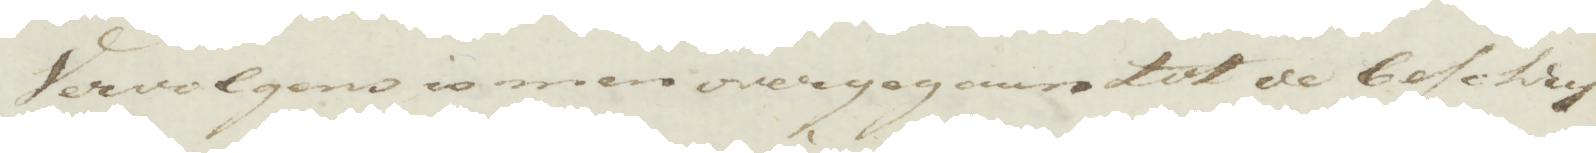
Vervolgens is men over gegaan tot de beschrij
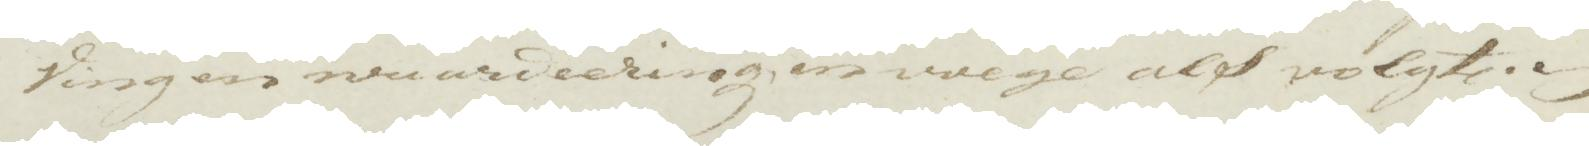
Ving en waardeering in voege als volgt.
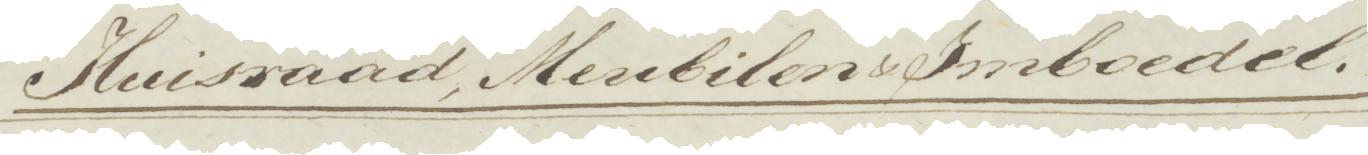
Huisraad, Meubilen & Imboedel.
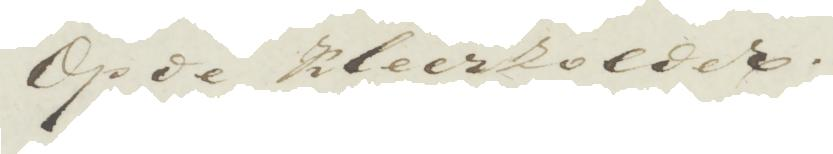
Op de Kleerzolder.
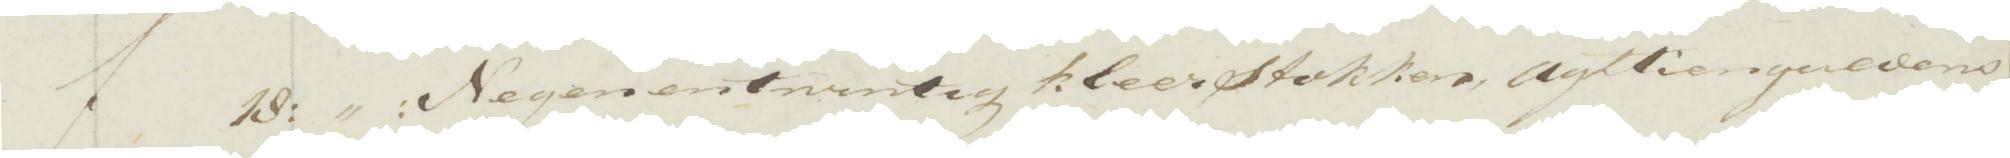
ƒ 18: „: Negen entwentig kleerstokken agttien guldens
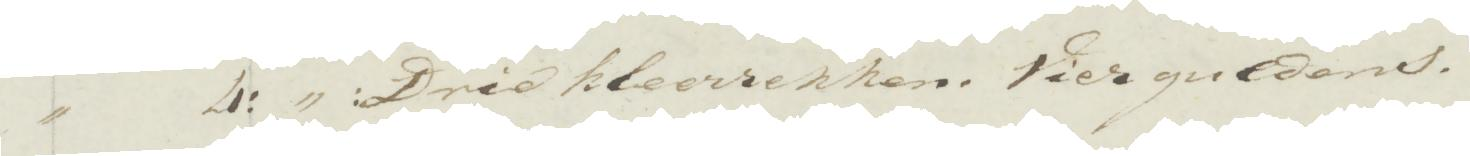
„ 4: „: Drie kleerrekken vier guldens.
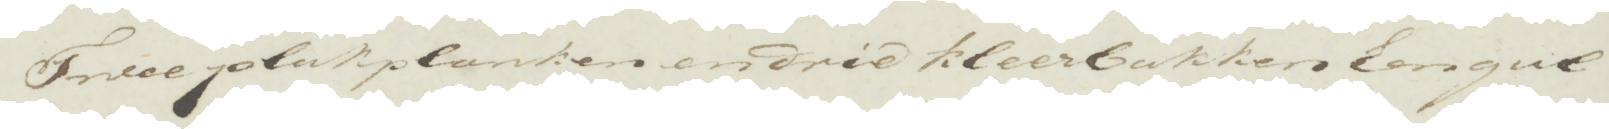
Twee plakplanken en drie kleerbakken Een gul
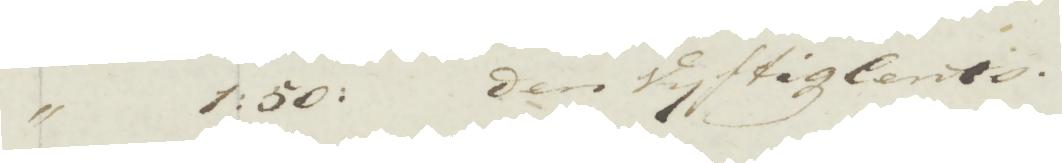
„ 1: 50: den vyftig Cents.
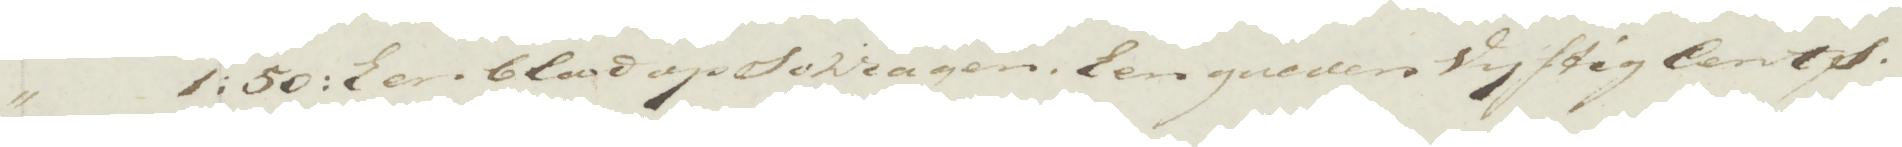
„ 1: 50: Een blad op schragen. Een qulden vyftig Cents.
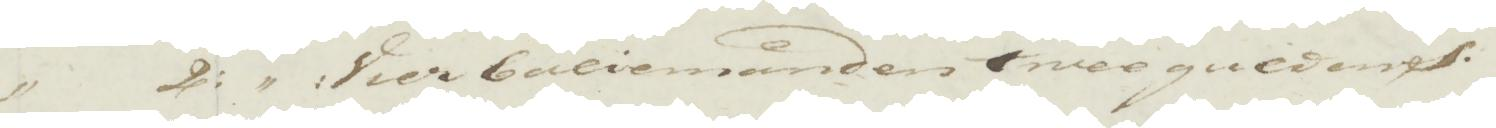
„ 2: „: Vier baliemanden twee guldens.
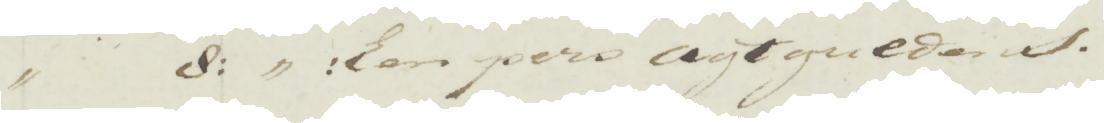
„ 8 „: Een pers agt quldens.
